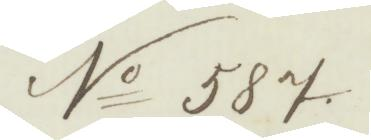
N=o 587.
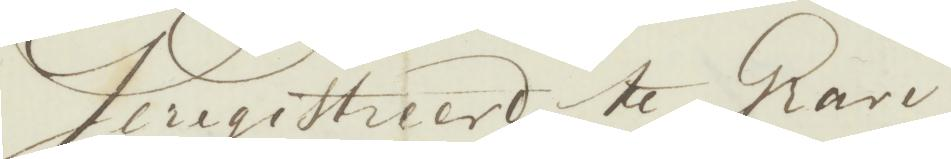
Geregistreerd te Grave
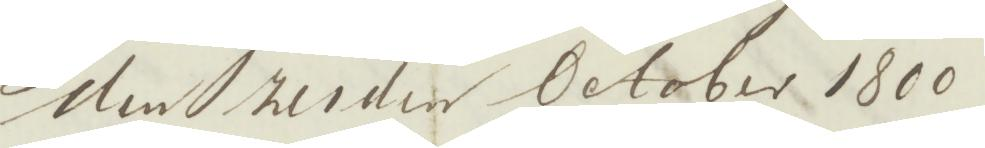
den zesden October 1800
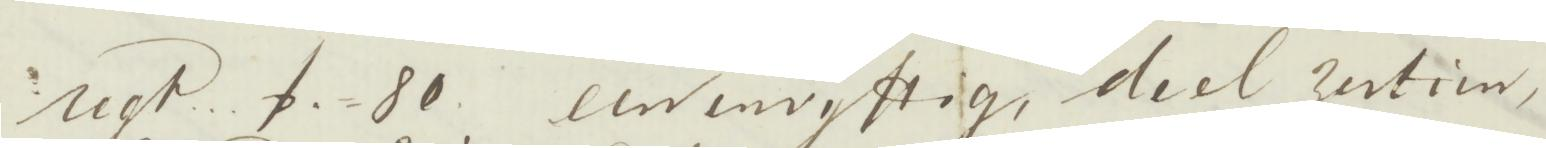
regt . . . ƒ.=80. een en vyftig, deel zestien,
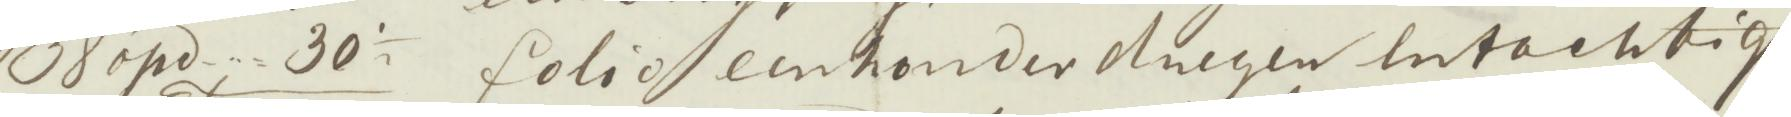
38 opc . . . = 30½ folio een honderd negen en tachtig
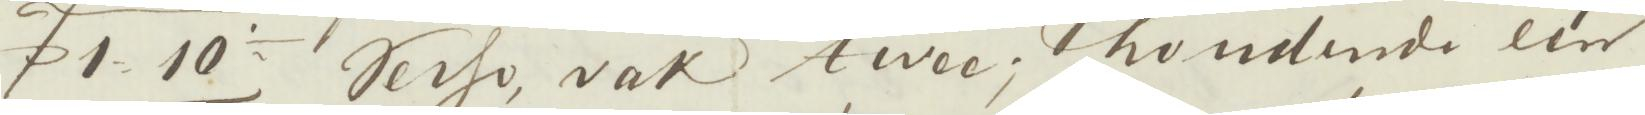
ƒ 1=10½ Verso, vak twee; houdende een
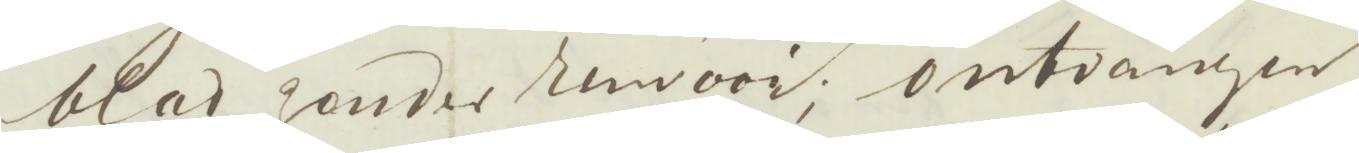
blad zonder renvooi; ontvangen
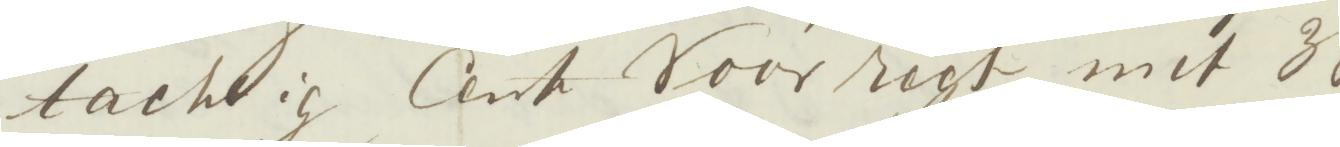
tachtig Cent Voor regt, met 38
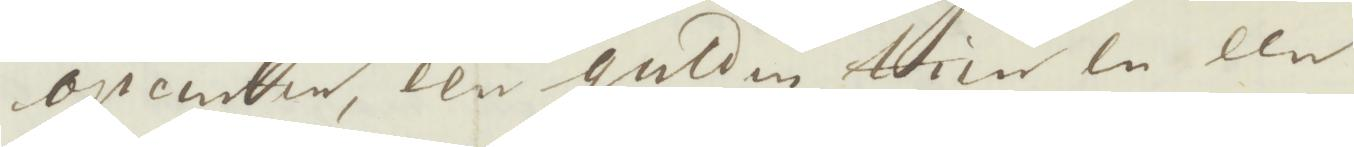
opcenten, een gulden tien en een
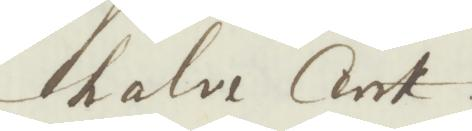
halve Cent
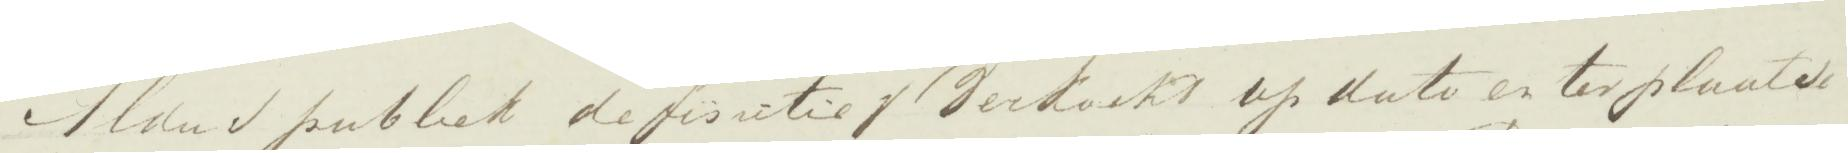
Aldus publiek definitief Verkocht op dato en ter plaatse
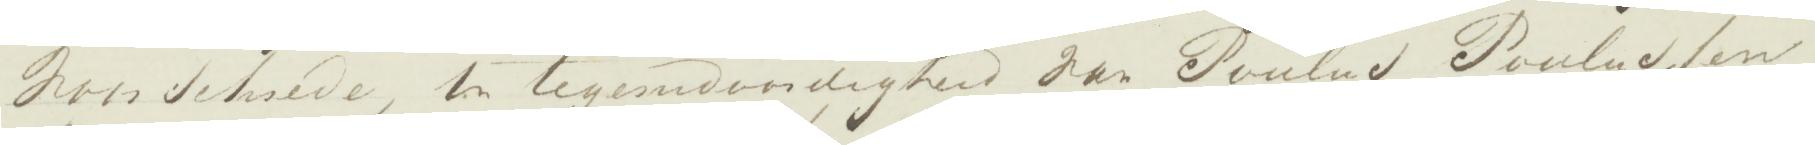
Voor schiede, in tegenwoordigheid van Paulus Paulussen
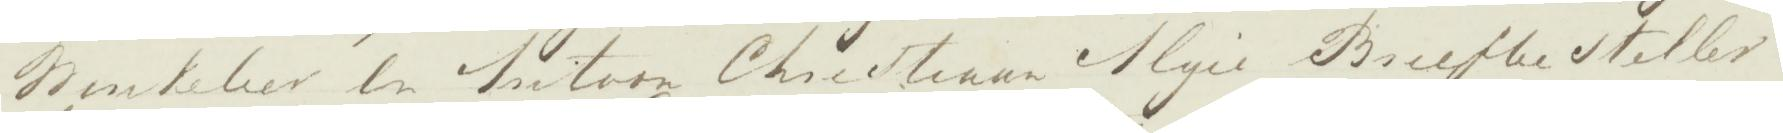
Winkelier en Antoon Christiaan Algie Briefbesteller
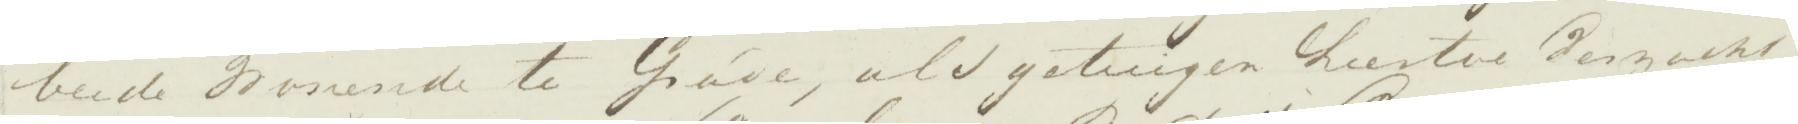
beide wonende te Grave, als getuigen hiertoe Verzocht,
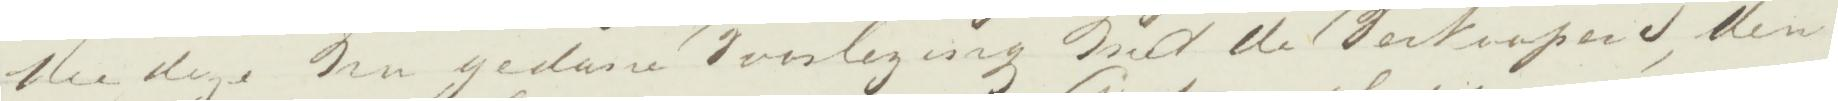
die deze nu gedane voorlezing met de Verkoopers, den
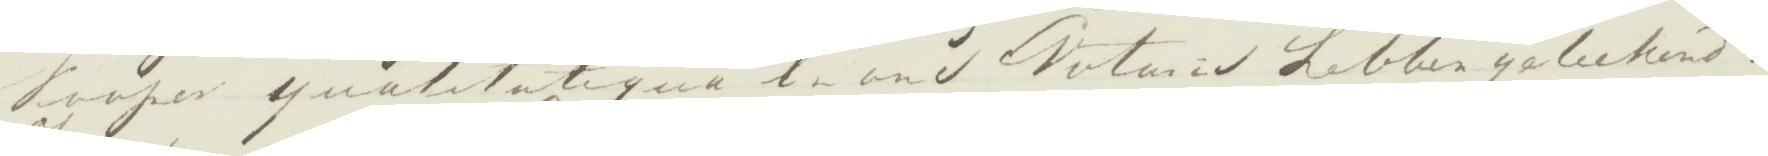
kooper qualitatique thans Notaris hebben geteekend:
